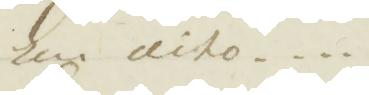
Een dito . . . . . .
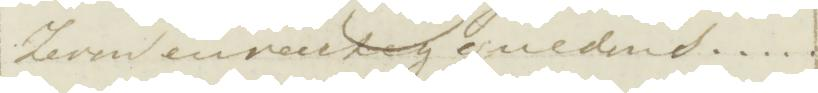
Zeven en veertig guldens. . . . „
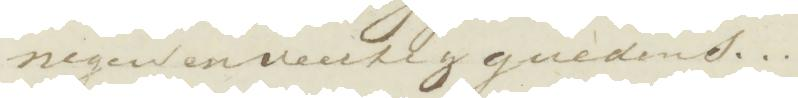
negen en veertig guldens. . .
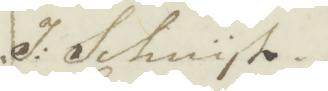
J: schuijt.
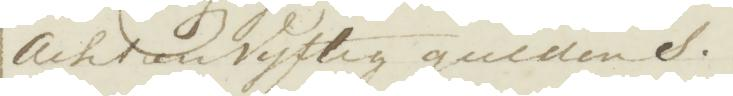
acht en Vyftig guldens.
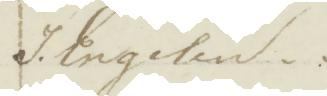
I. Engelen. . .
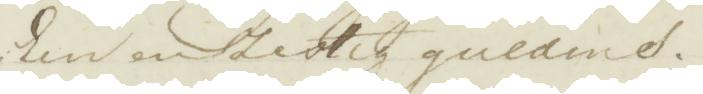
Een en Zestig guldens.
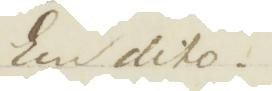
Een dito. .
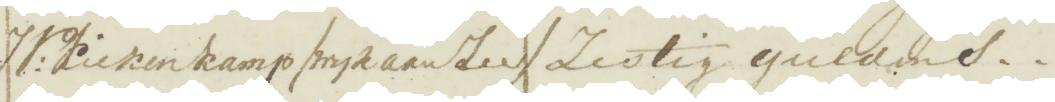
H: Piekenkamp / wyk aan Zee / Zestig guldens.
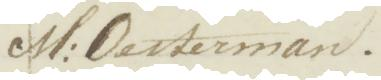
M: Oosterman.
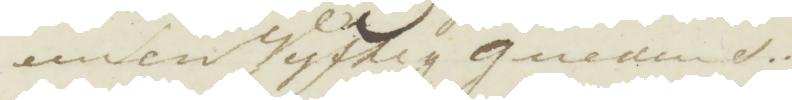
eenen Vyftig guldens.
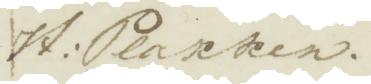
H: Plakken.
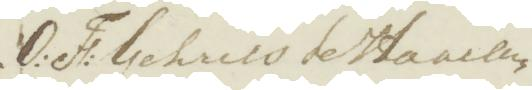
O: F: Gehrels te Haarlem
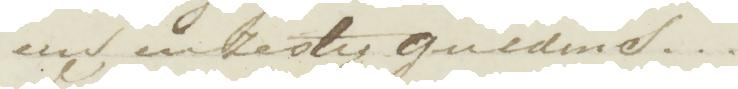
een en zestig guldens . . .
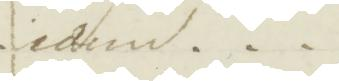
idem. . . . .
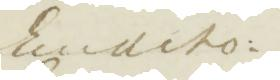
Een dito:
